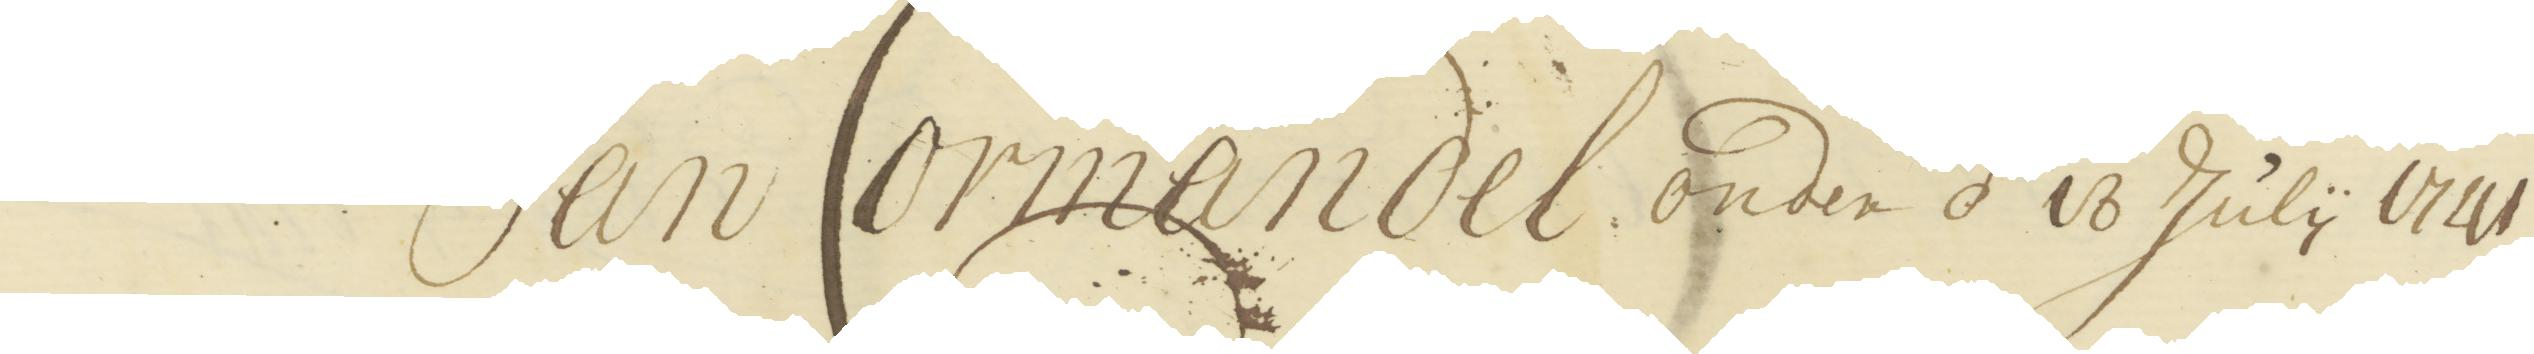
Van Cormandel onder dto 18 Julij 1741
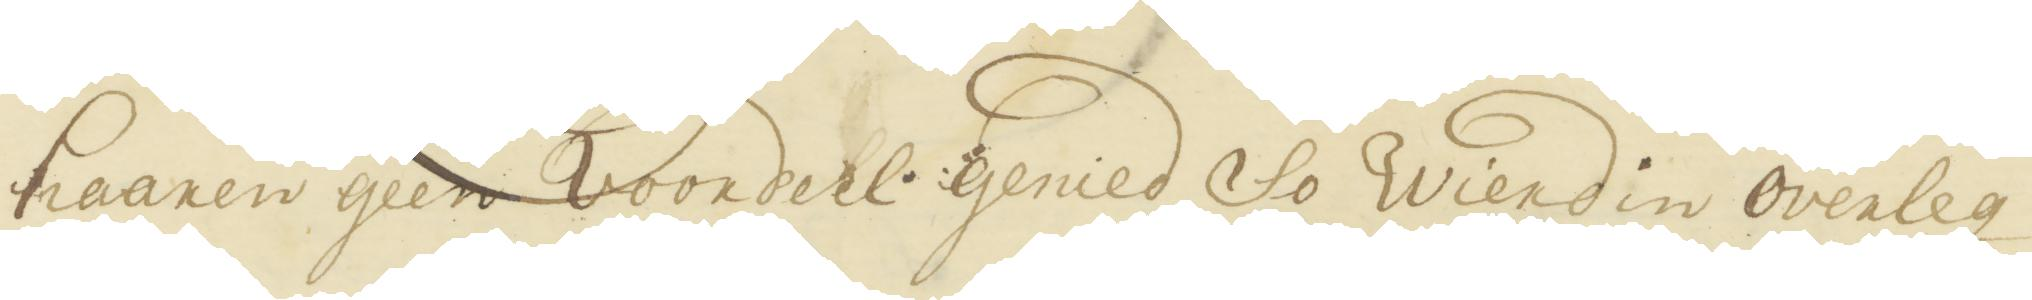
haaren geen voordeel genied so wierd in overleg
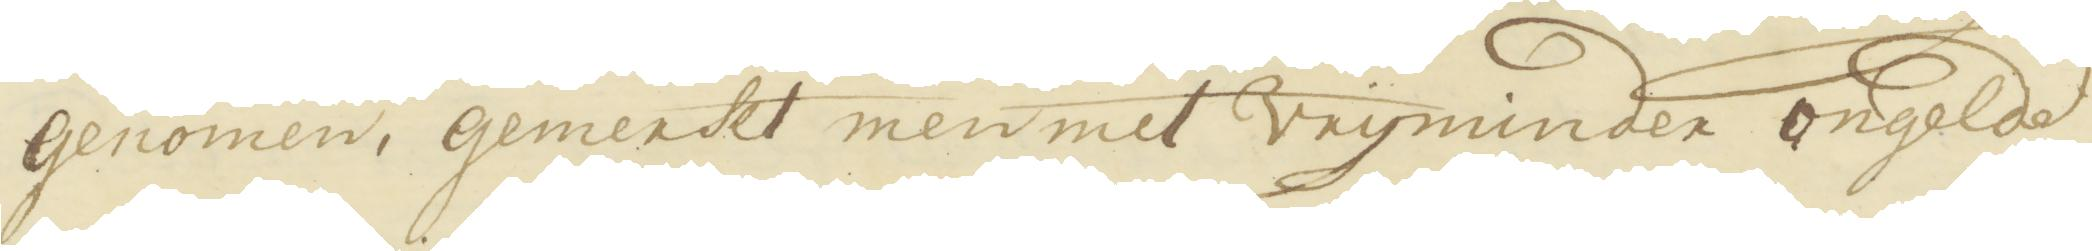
genomen, gemerkt men met vrijminder ongelde
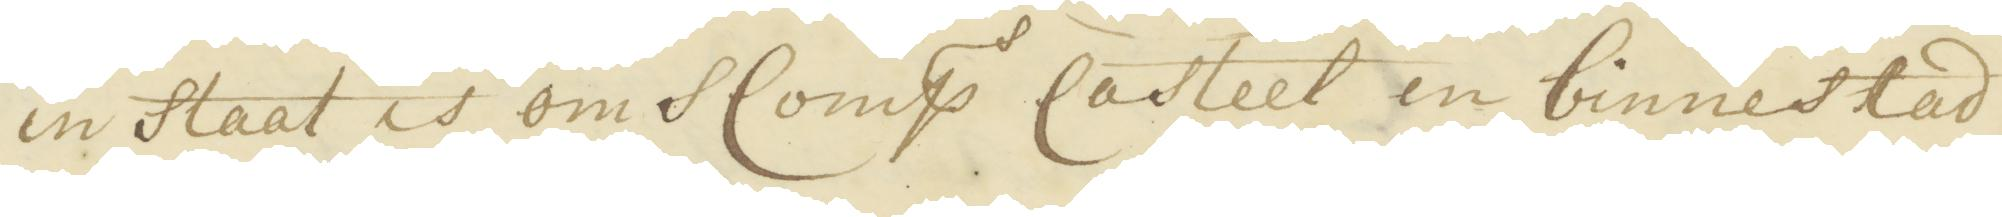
in staat is om s Comps Casteel en binnestad
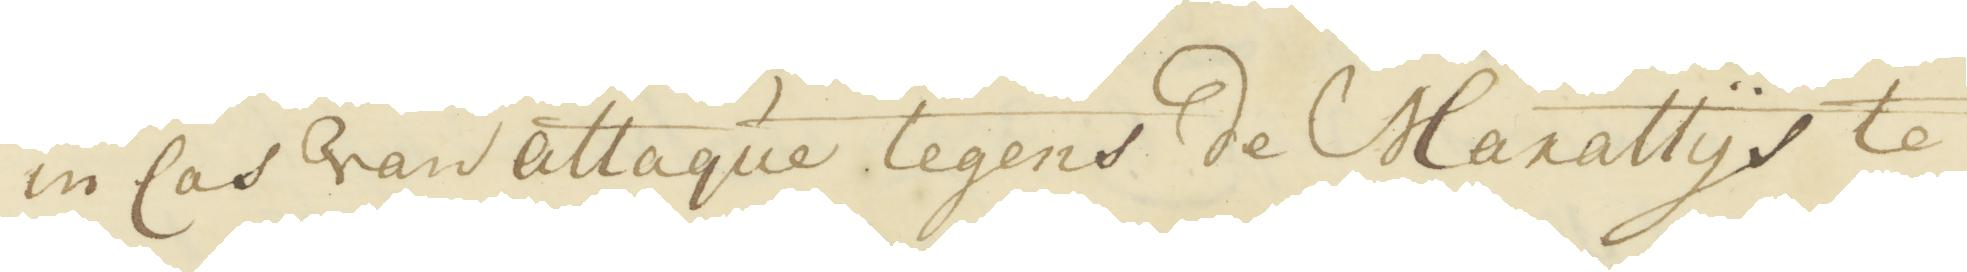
in Cas van attaque tegens de Marattijs te
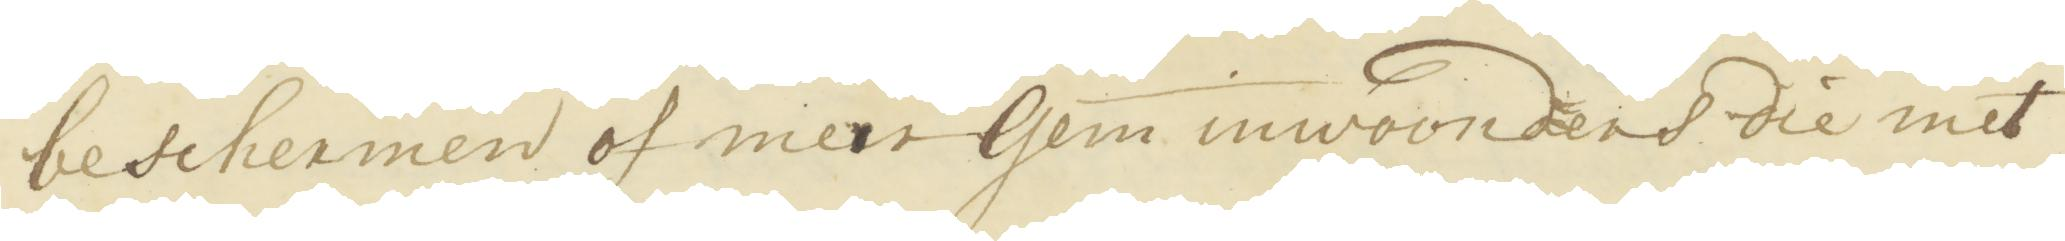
beschermen of met Gem inwoonders die met
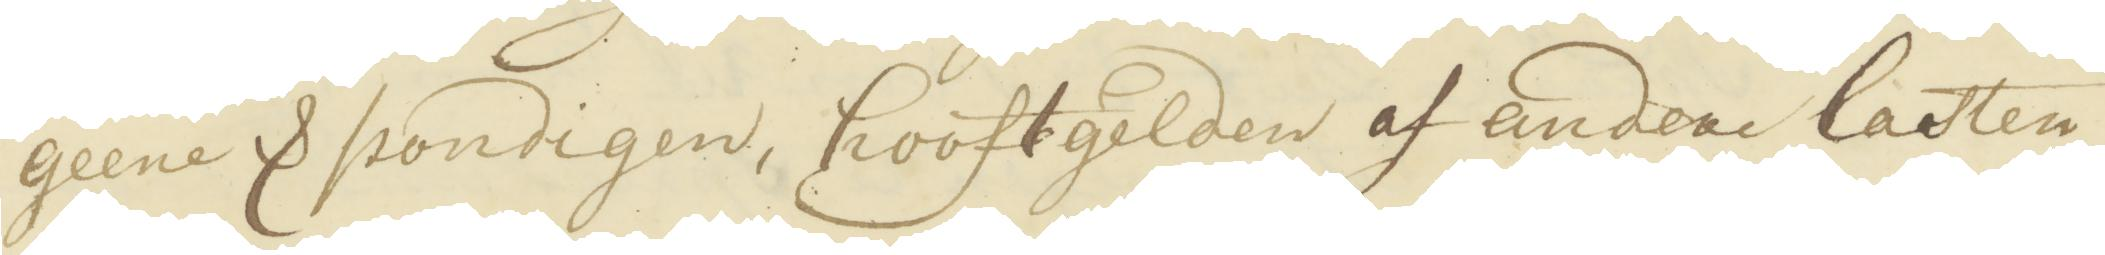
geene verpondigen, hooftgelden of andere lasten
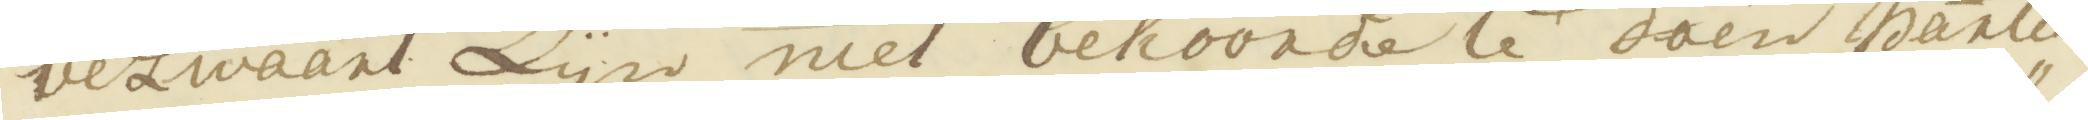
bezwaart zijn, niet behoorde te doen parti„
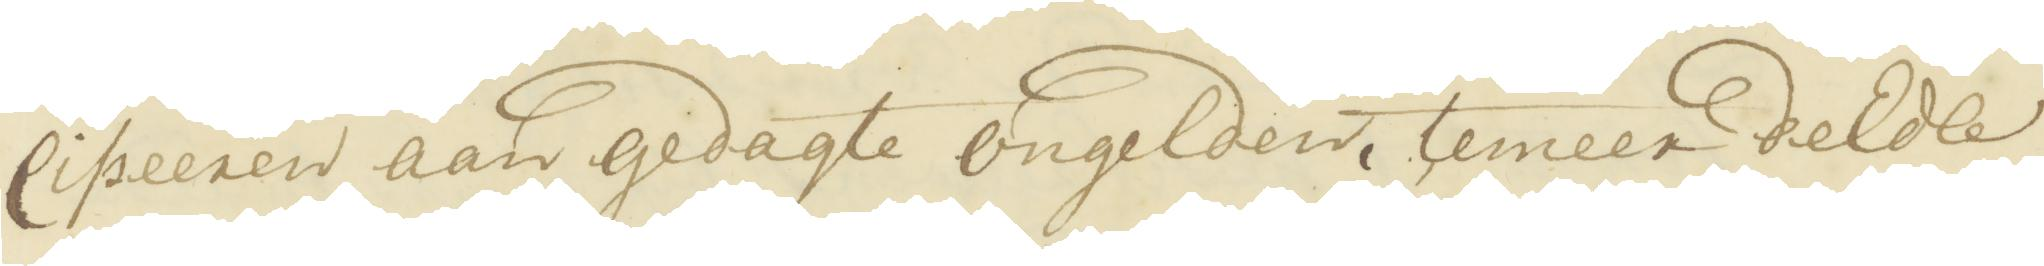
cipeeren aan gedagte ongelden, temeer de Edle
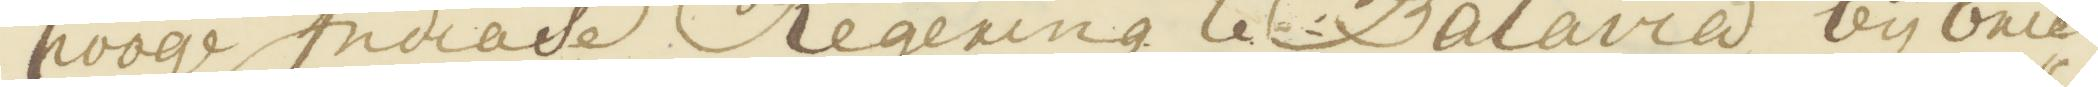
hooge Jndiase Regering te Batavia bij brie„
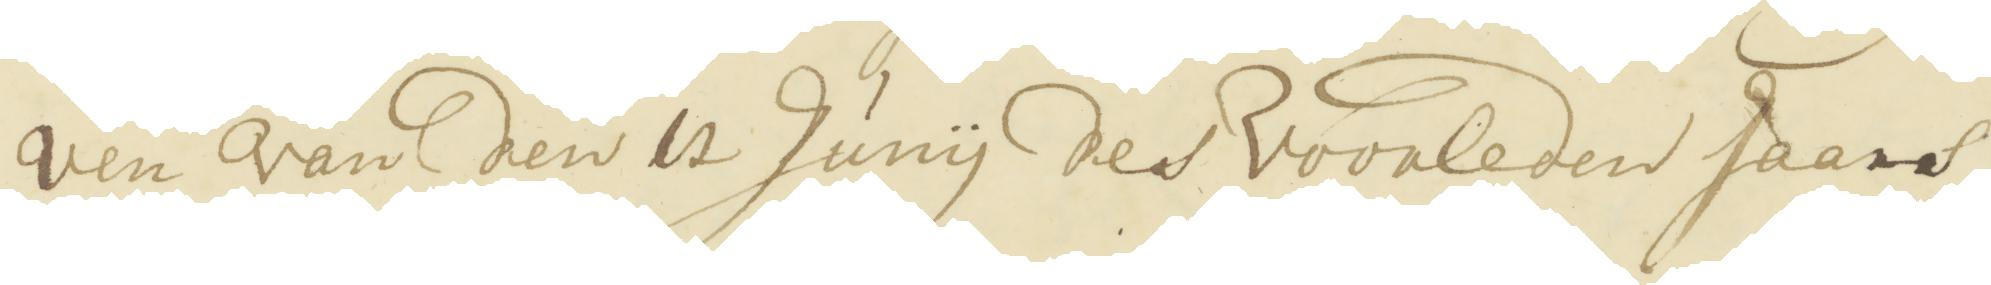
ven van den 12 Junij des voorleden Jaars
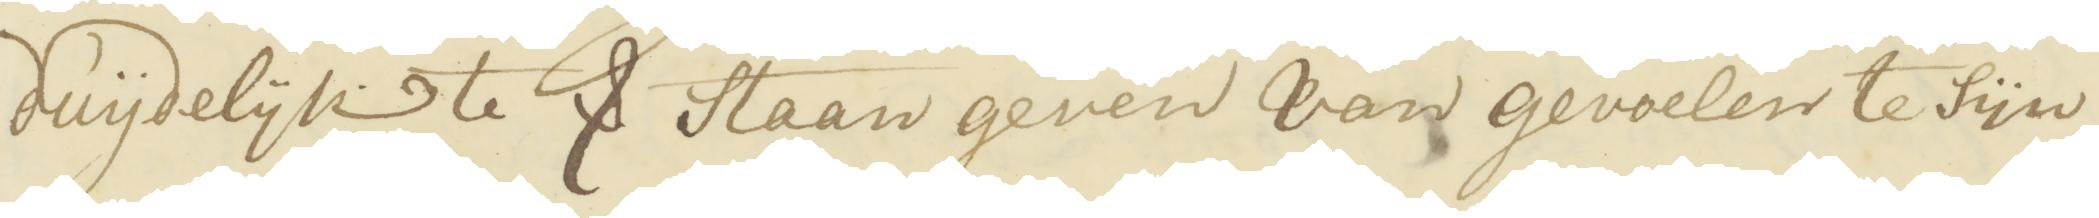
duijdelijk te verstaan geven van gevoelen te sijn
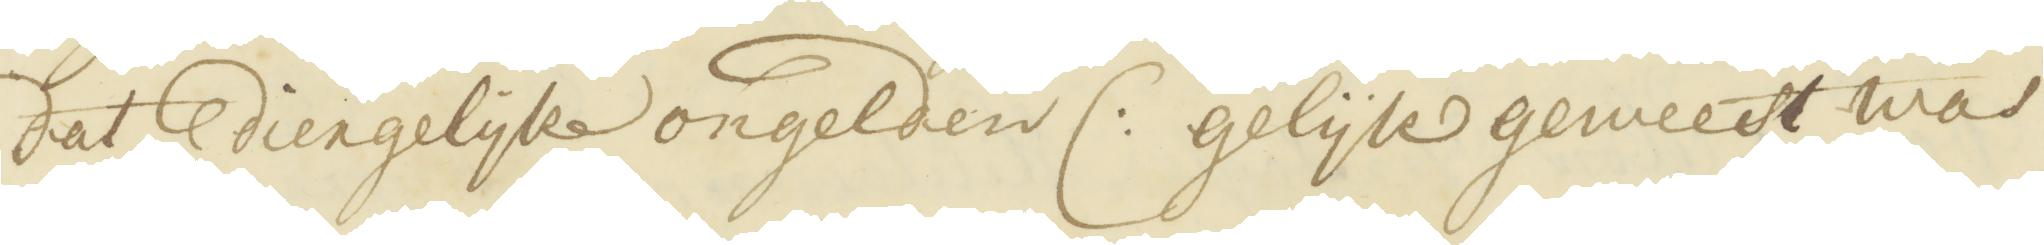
dat diergelijke ongelden (:gelijk geweest was
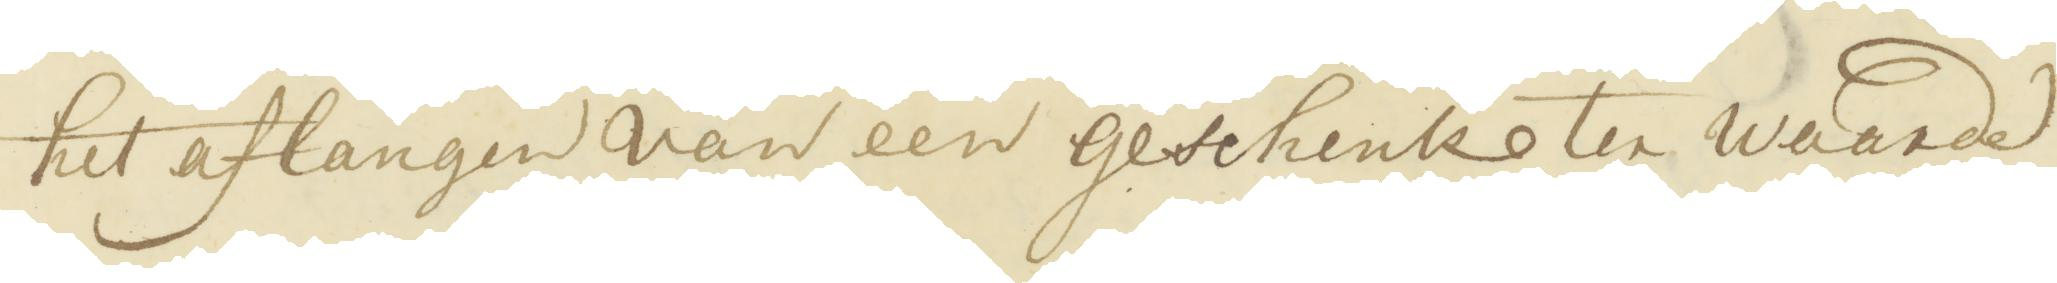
het aflangen van een geschenk ter waarde
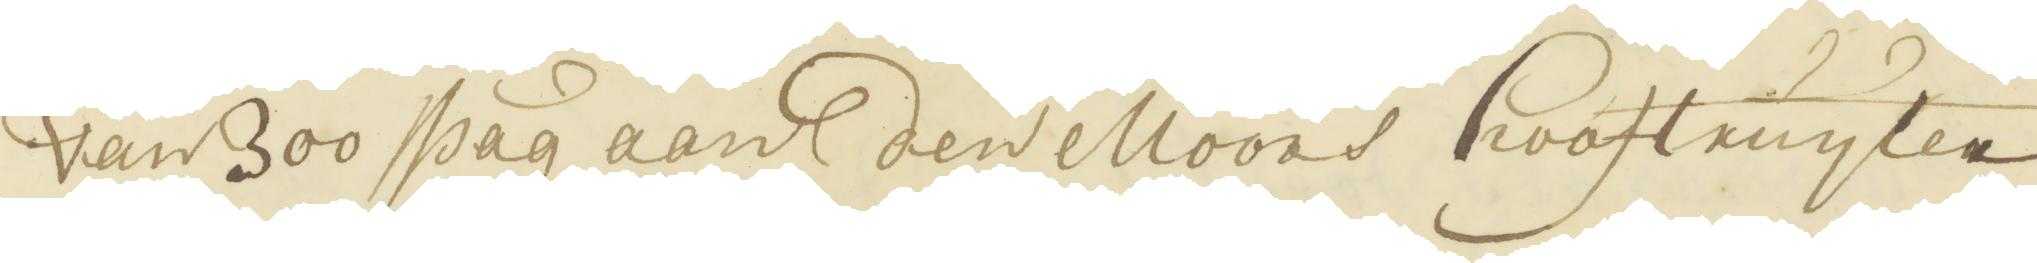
van 300 ppag aan den Moors hooftruyter
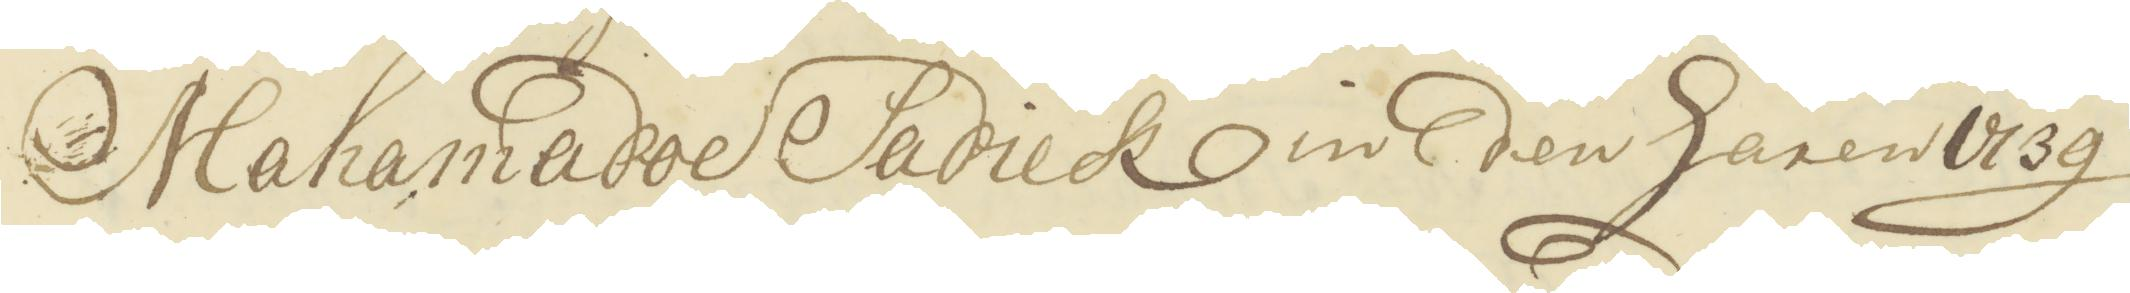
Mahamadoe Sadiek in den Jaren 1739
